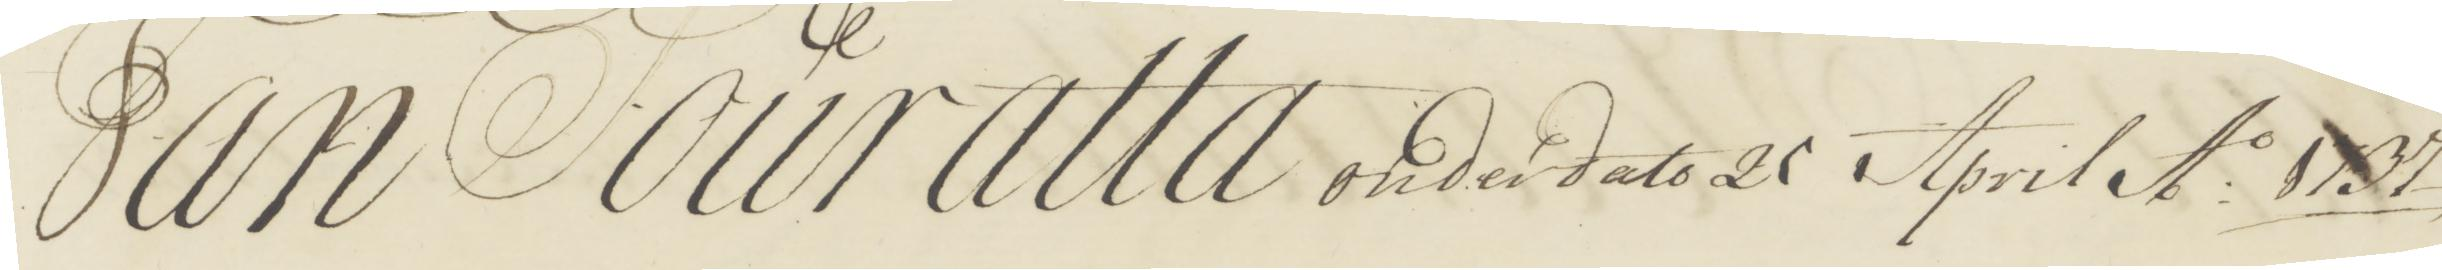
Van Souratta onderdato 25 April A:o 1737—
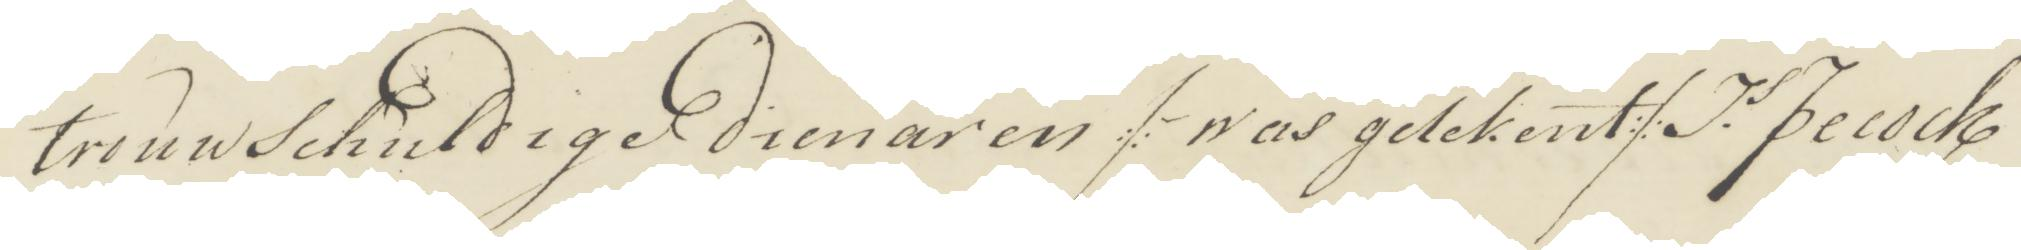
trouwschuldige dienaren :/: was getekent:/: I:s Pecock
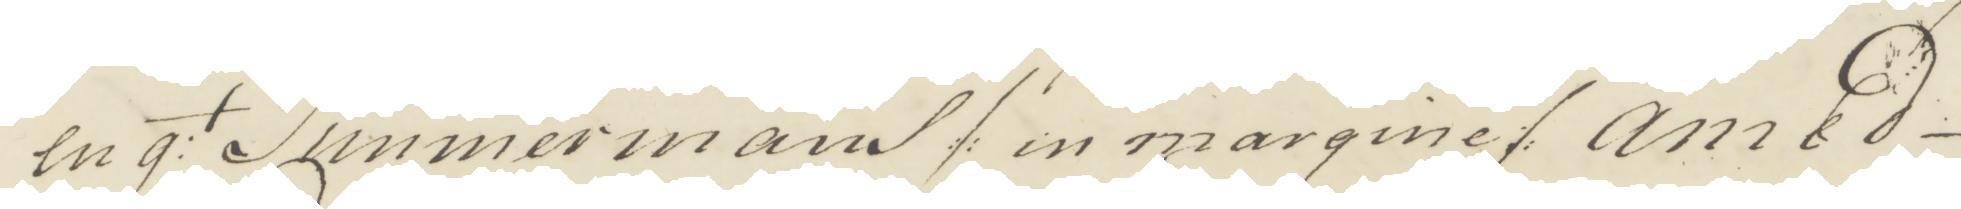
en g:t Timmermans :/: in margine./: Amed—
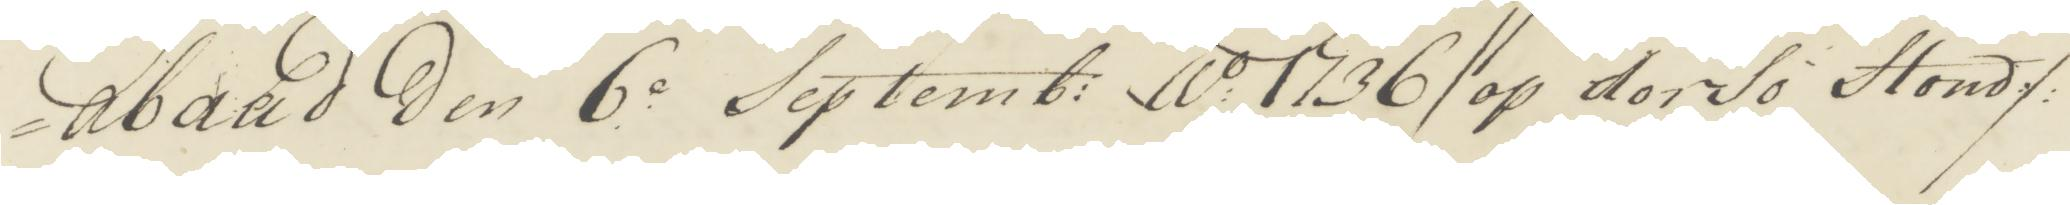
=abaad den 6:e Septemb: A:o 1736/ op dorso stond:/:
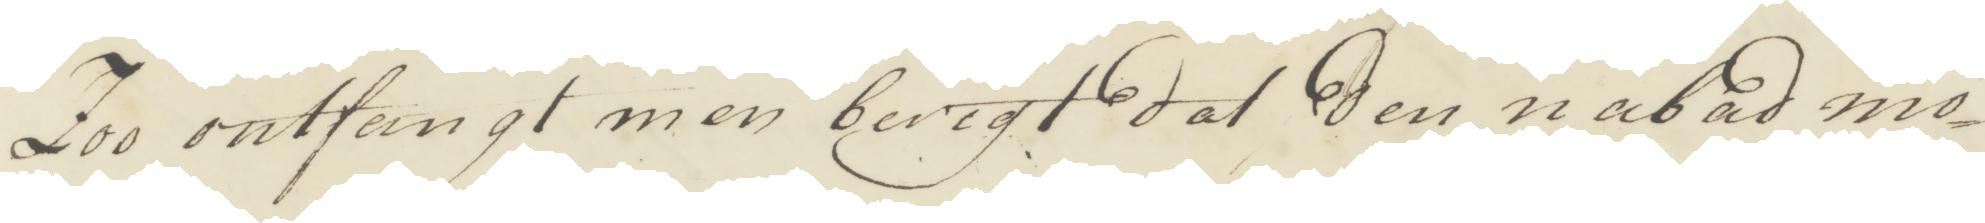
Zoo ontfangt men berigt dat den nabad mo„
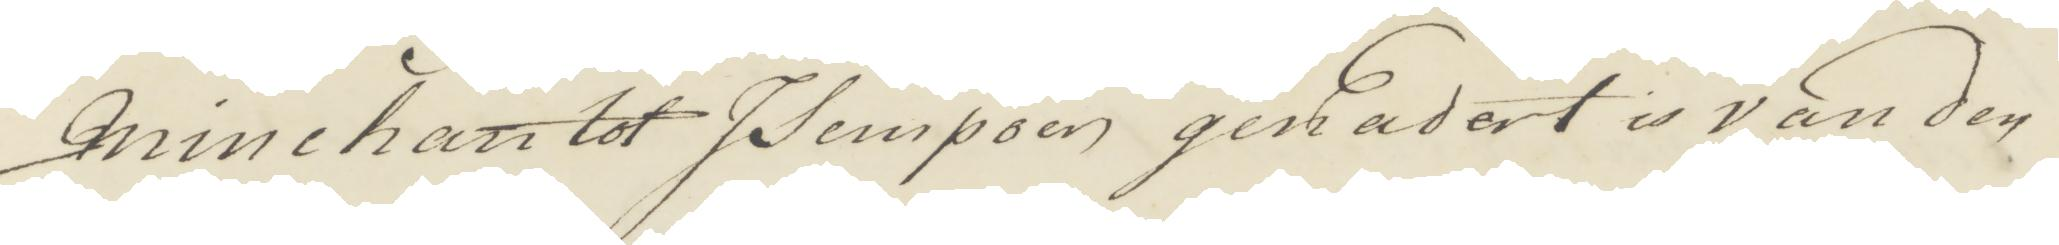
Minchan tot Jsempoen genadert is van den
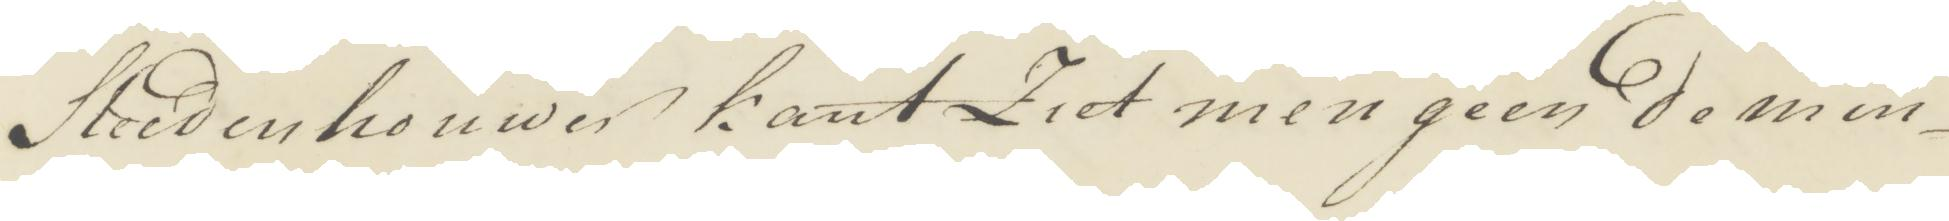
steedenhouwer kant Ziet men geen de min„
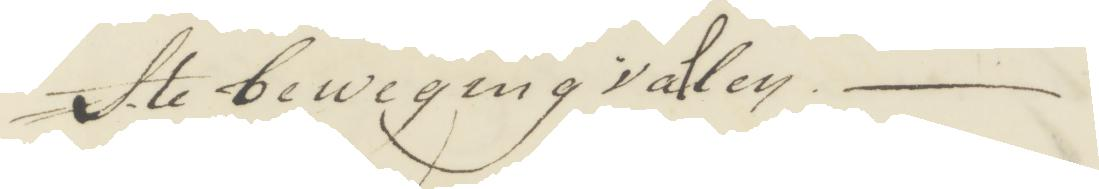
„ste beweging vallen. —
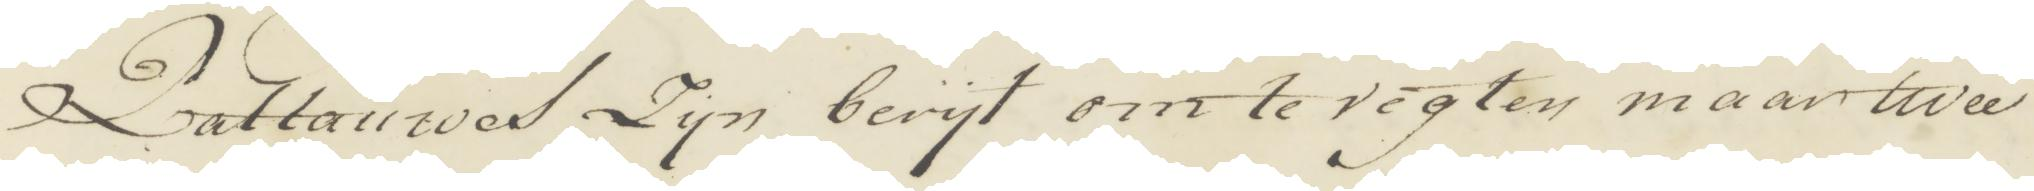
Lattauws zijn berijt om te vegten maar twee
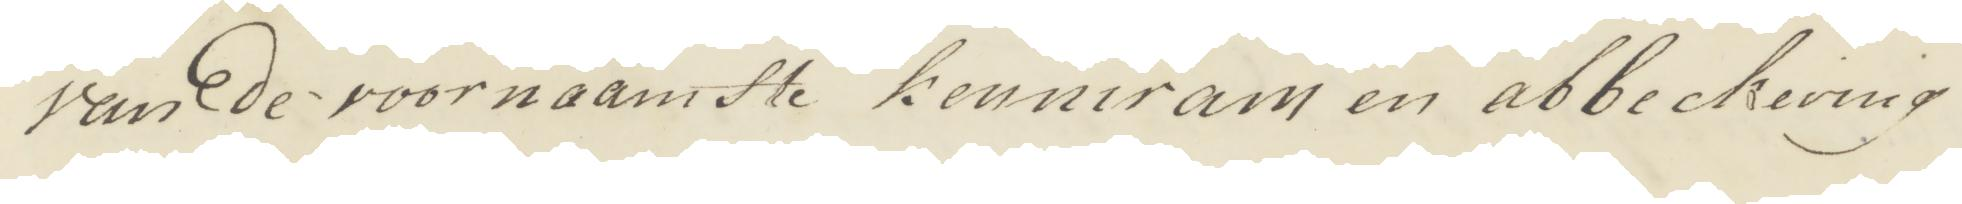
van de voornaamste kenniram en abbeckering
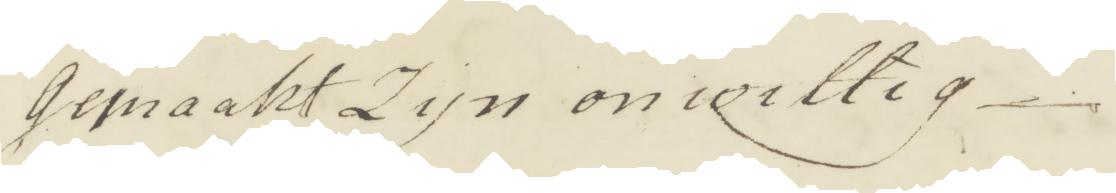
Gemaakt zijn onwillig —
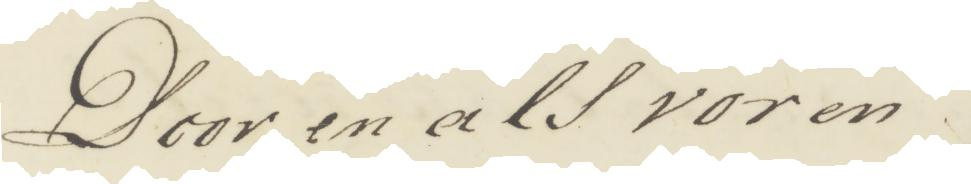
Door en als voren.
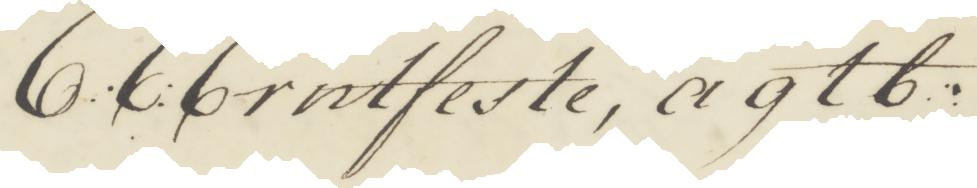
E: E: Erntfeste, agtb:
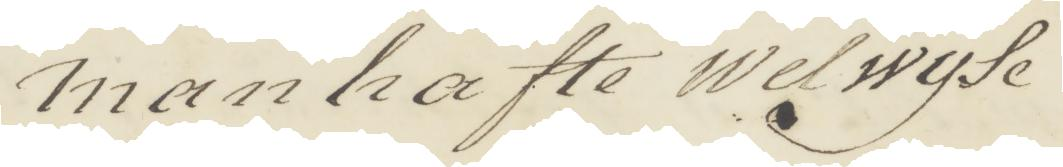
manhafte wel wijse
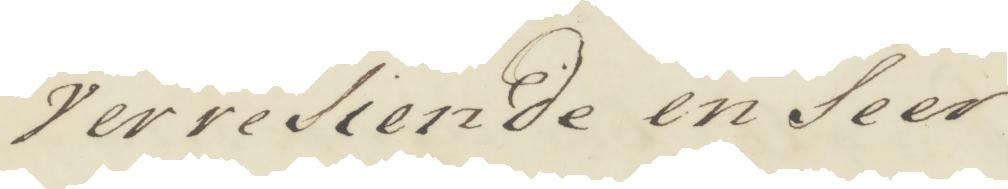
Verresiende en seer
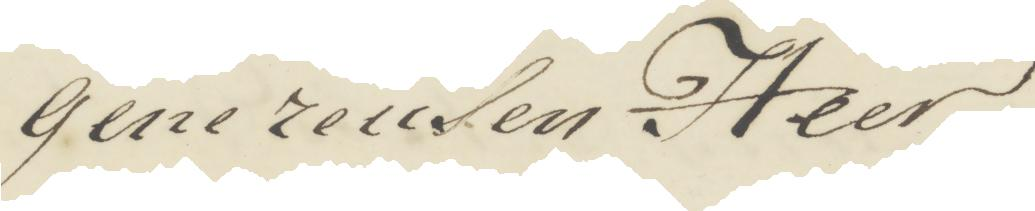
gene reusen Heer—
